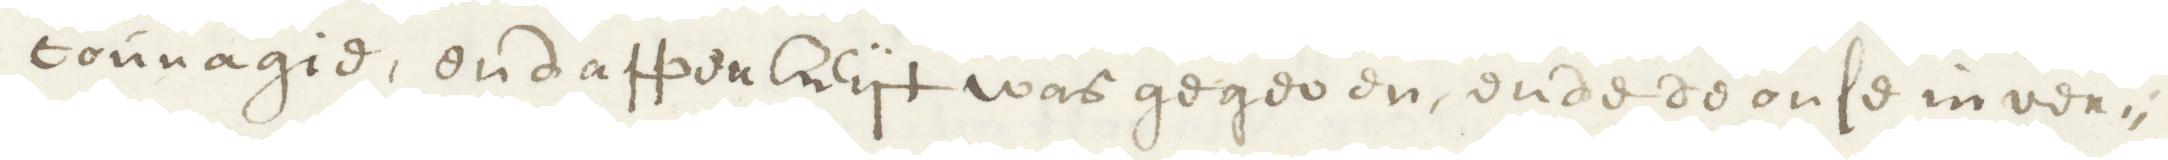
couragie, en dapperheijt was gegeven, ende de onse in ver„
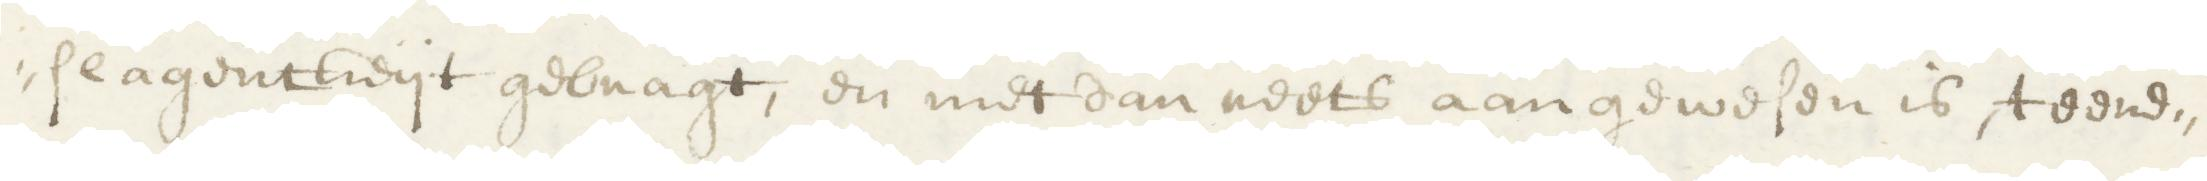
„slagentheijt gebragt, en met dan reets aangewesen is, t eene„
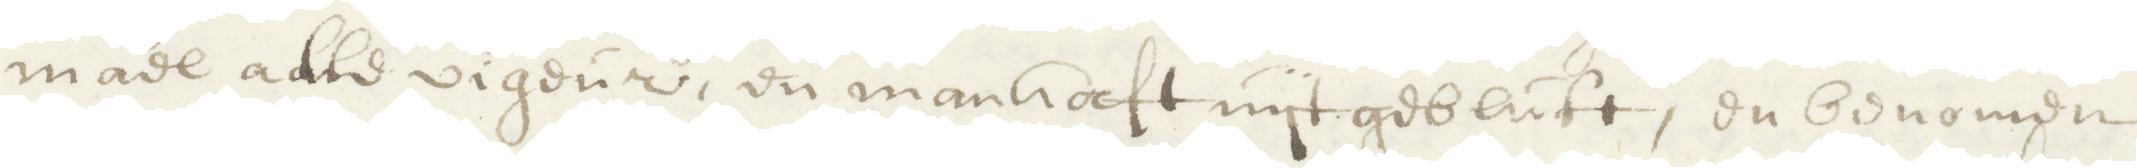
mael alle vigeur, en manhaft uijt geblust, en benomen
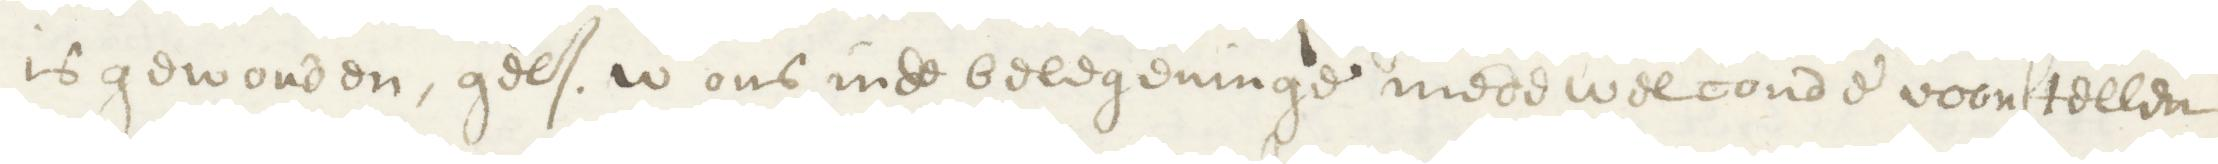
is geworden, gelijk w' ons inde belegeninge mede wel conde voorstellen
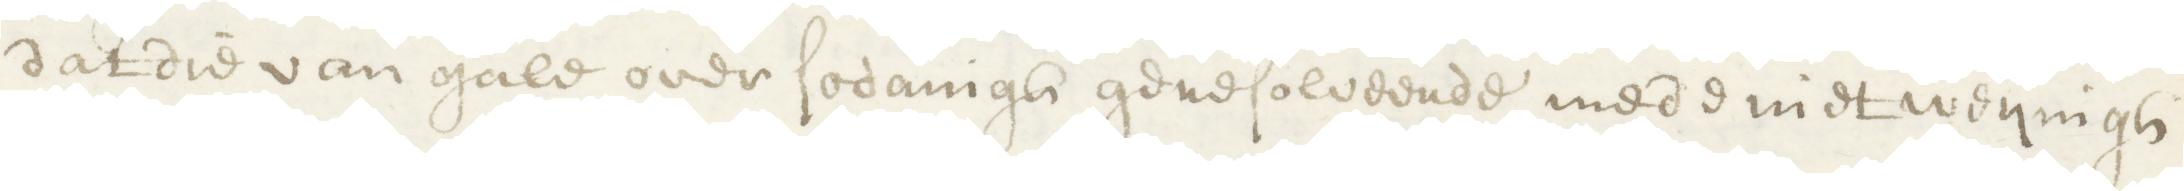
dat die van gale over sodanigh geresolveerde mede niet weijnigh
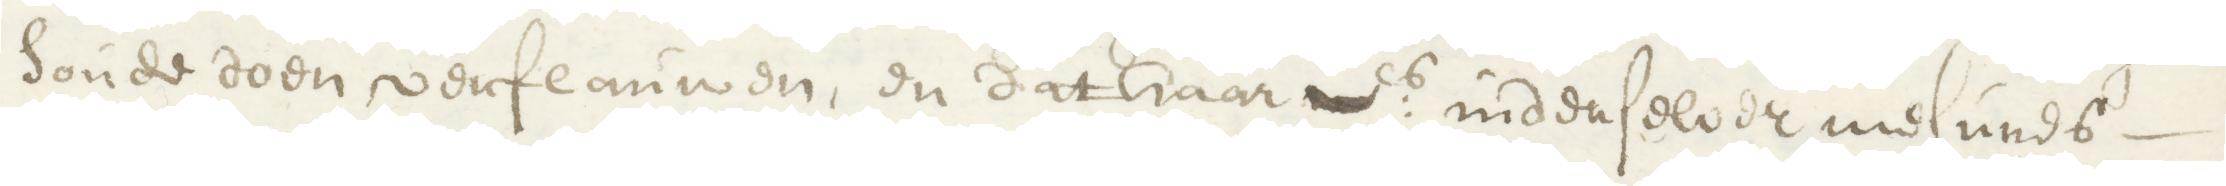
soude doen verflauwen, en dat haar E:s inderselver mesures —
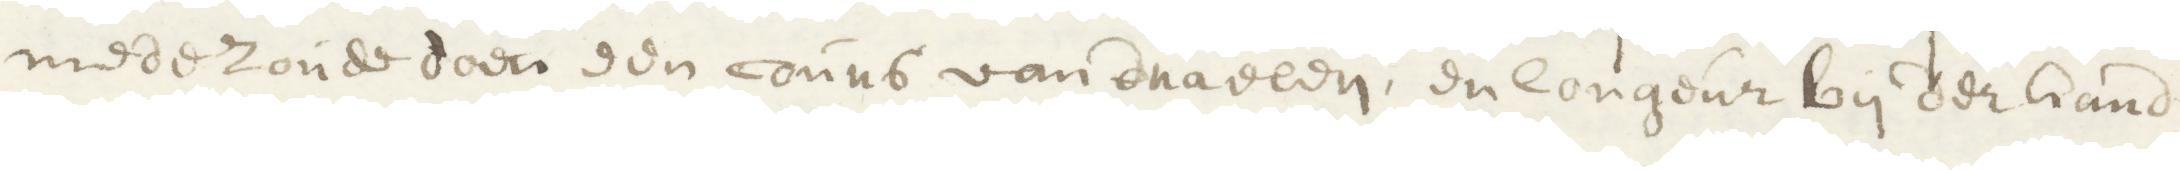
mede zoude doen een cours van draelen, en longeur bij der hand
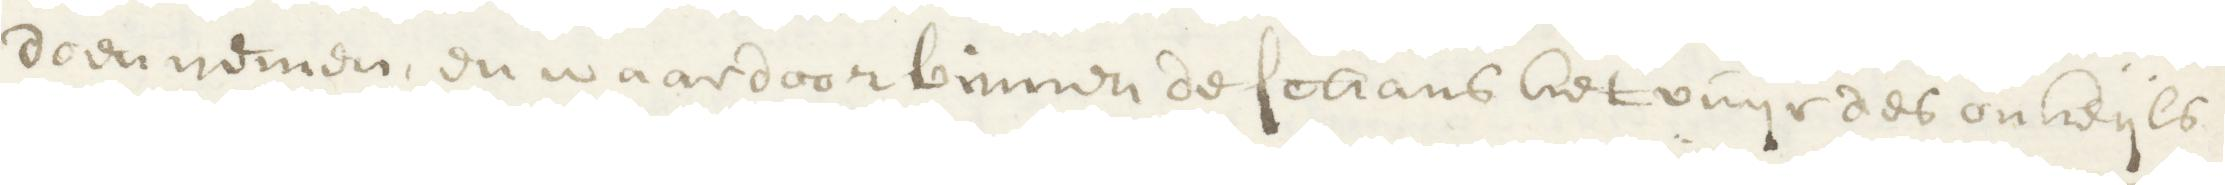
doen nemen, en waar door binnen de schans het vuijs des onheijls
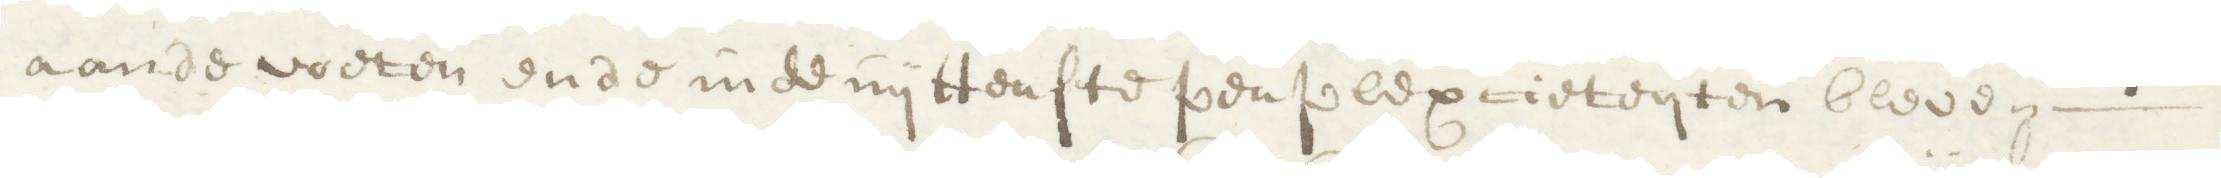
aan de voeten ende in de uijtterste perplexcieteijten bleven —
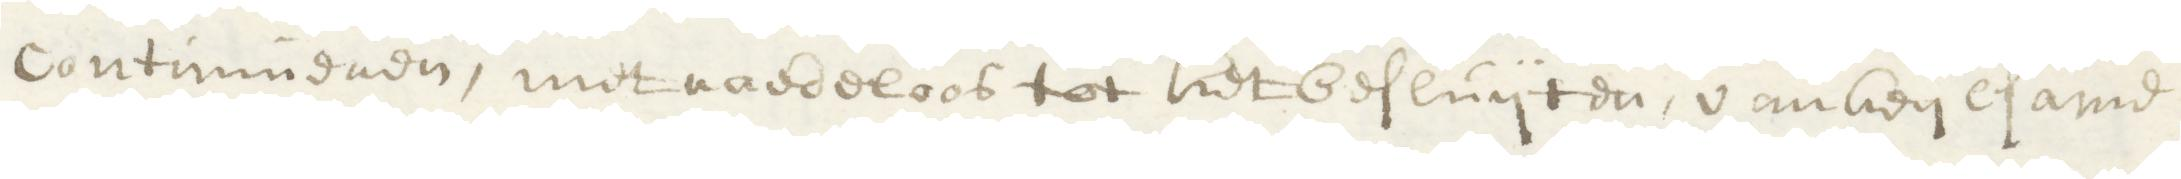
continueren, met raedeloos tot het besluijten, van heijlsame
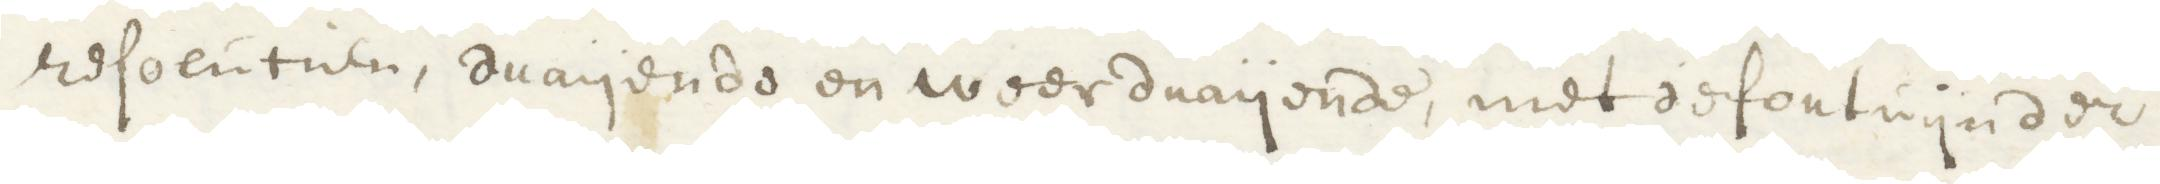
resolutien, draijende en weer draijende, met defortuijn der
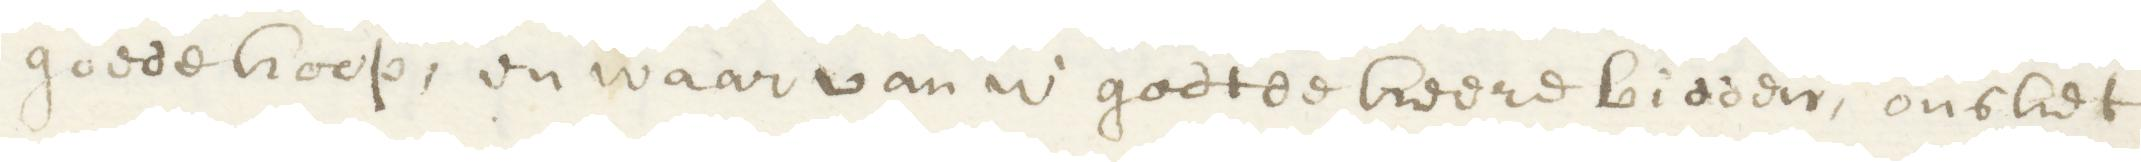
goede koop, en waar van w' godtde heere bidden, ons het
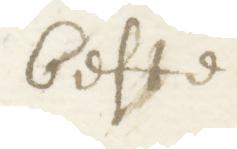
beste
